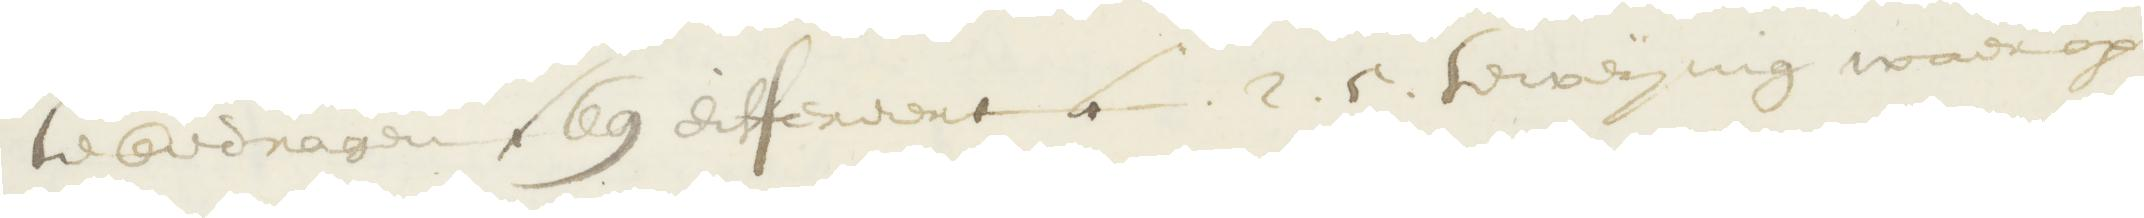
te bedragen ƒ 69 differeert ƒ 2.5. teweijnig waer op
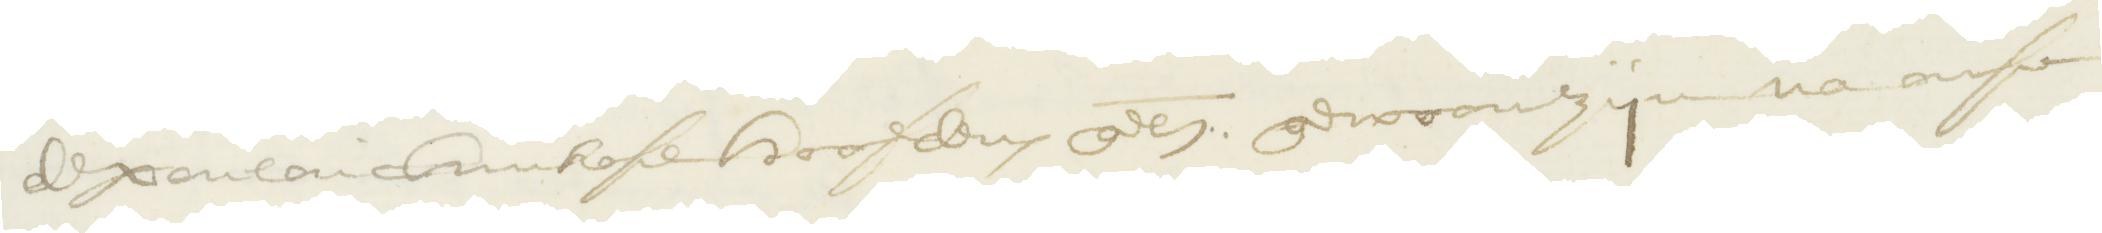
de poulou chinkose hoofden gem. gewoon zijn na onse
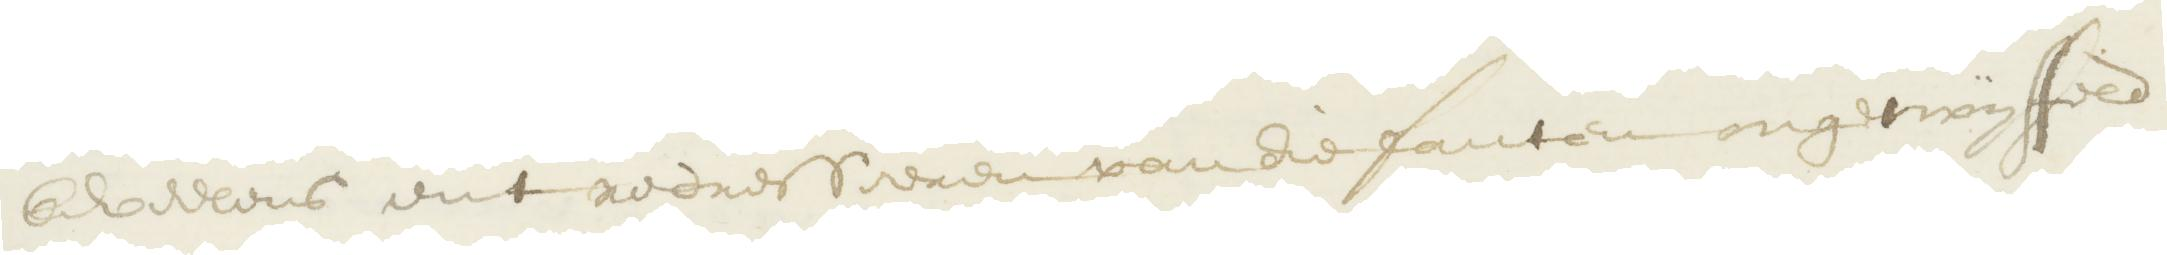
beveelens en’t redresseeren van die fauten ongetwijffeld
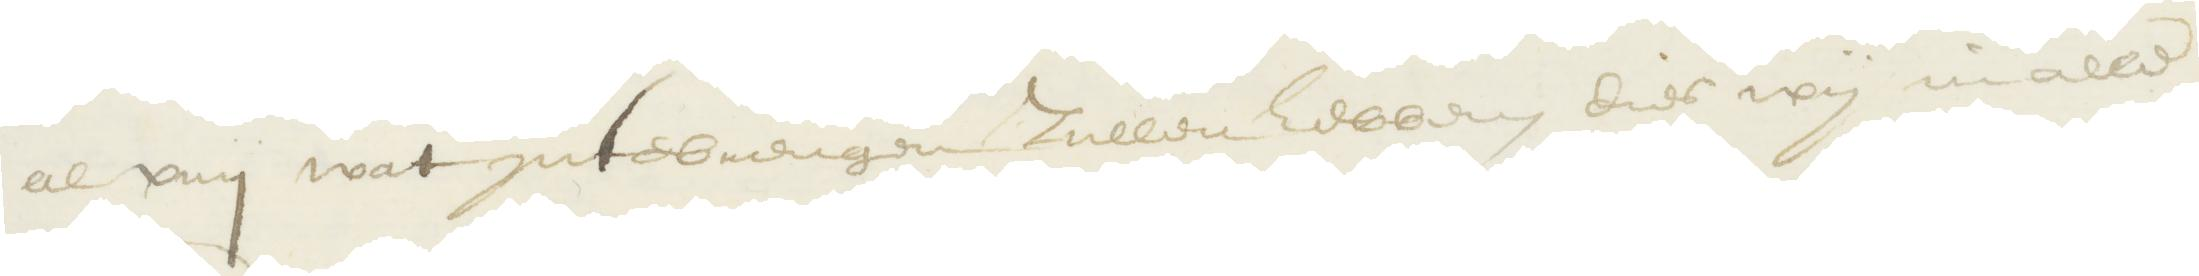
al vrij wat jntebrengen zullen hebben dies wij in alle
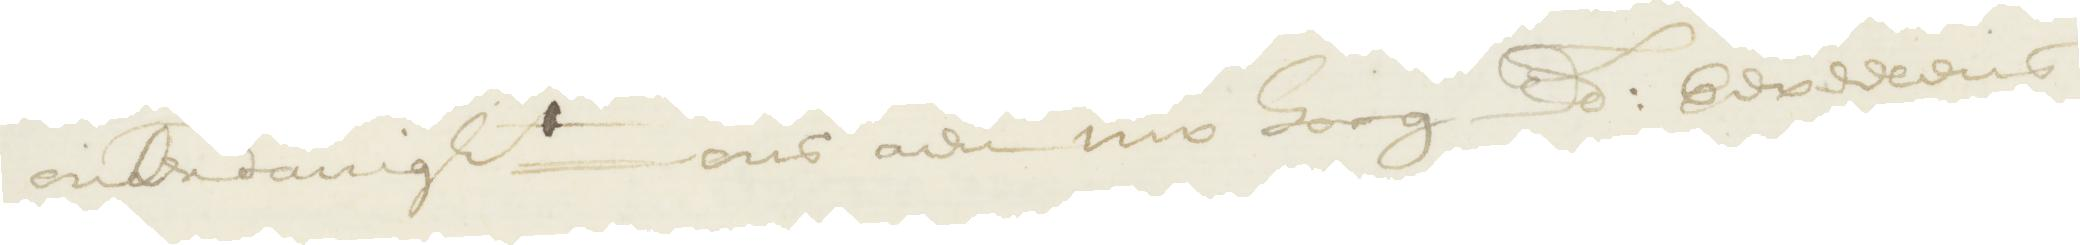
onderdanigh=t ons aen uw hoog Ed: beveelens
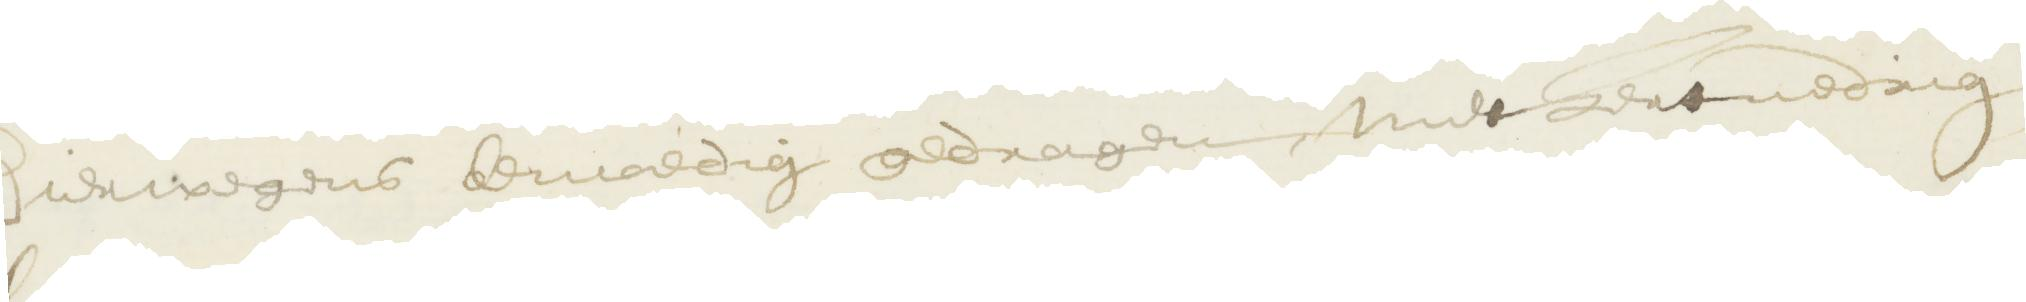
Dierwegens demoedig gedragen, met hertnedrig
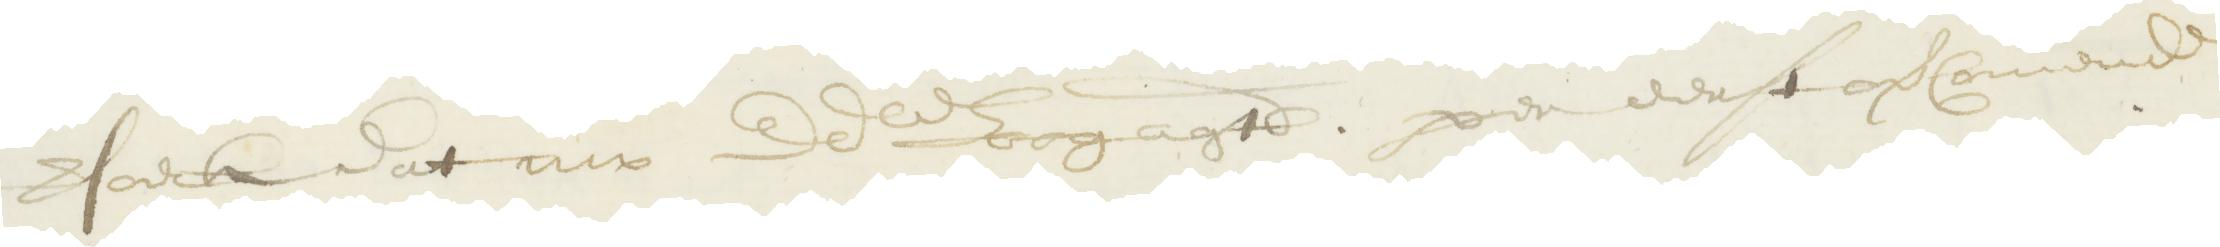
versoeck dat uw Ed=le hoog agtb. per eerst overcomende
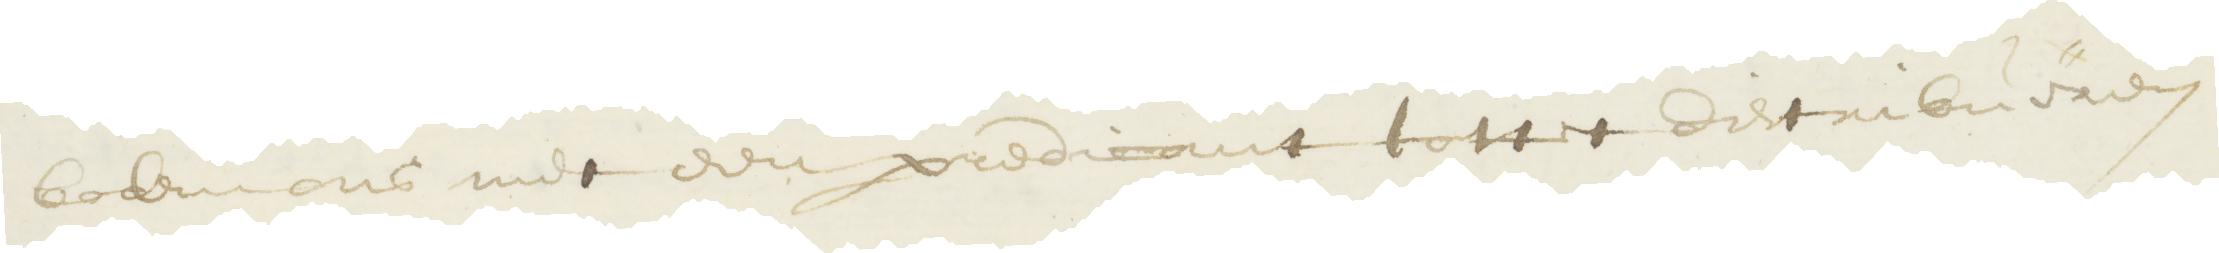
boden ons met een predicant tott ’t distribuëren
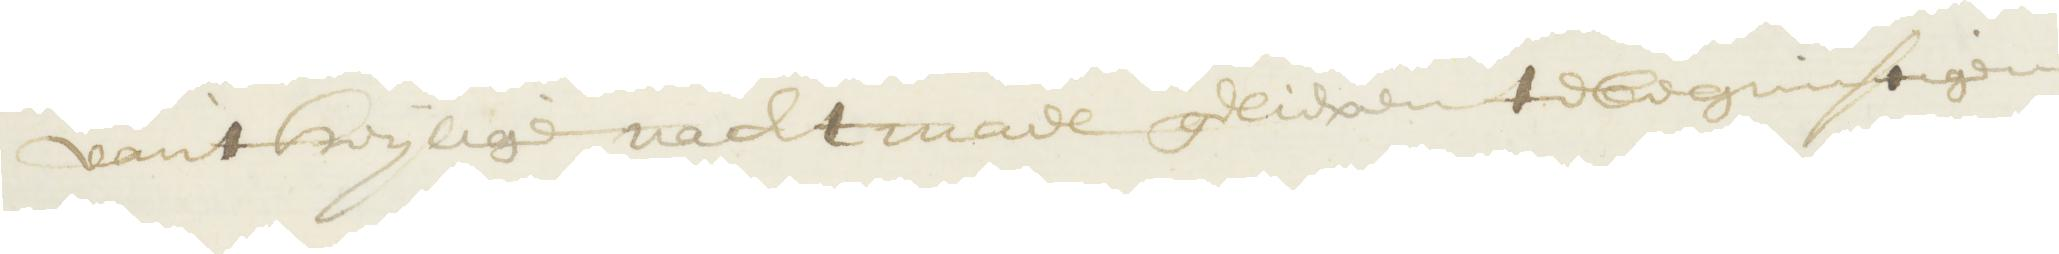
van ’t heijlige nacht mael gelieven te begunstigen
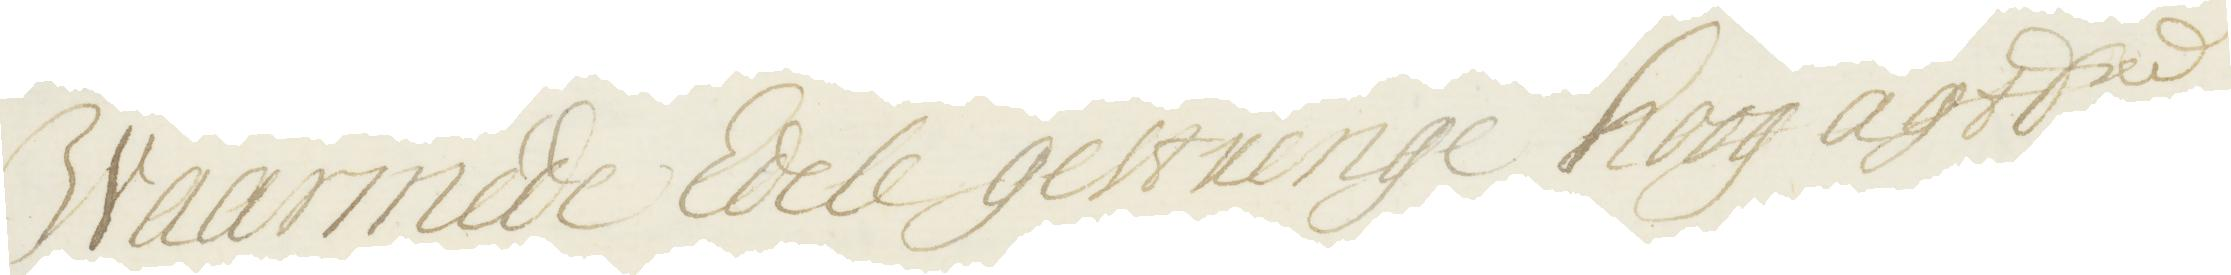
Waarmede Edele gestrenge hoog agtb=re
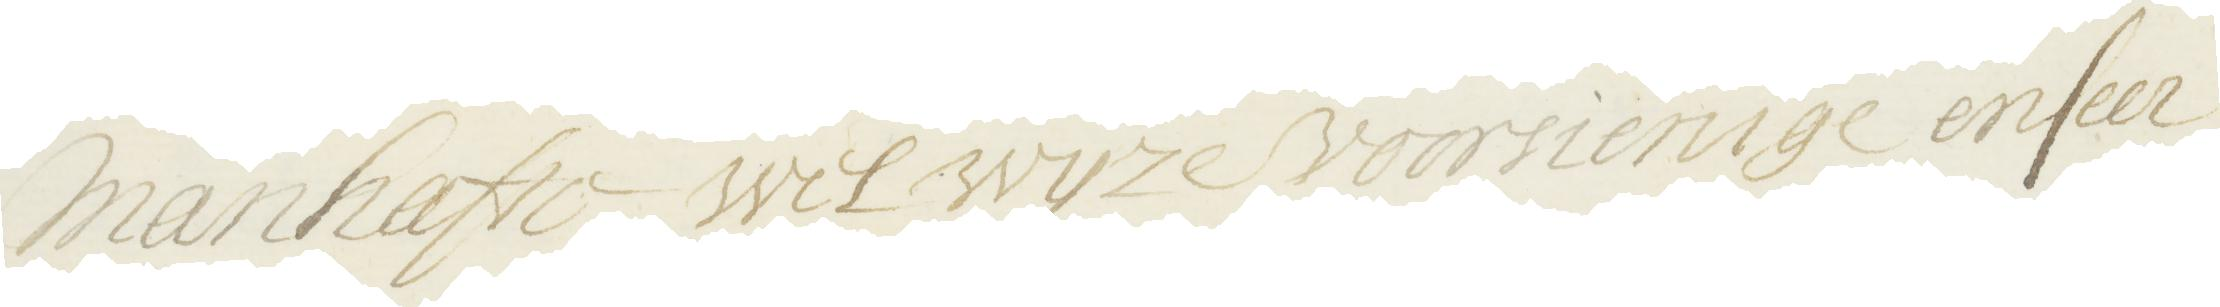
manhafte wel wijze voorsienige enseer
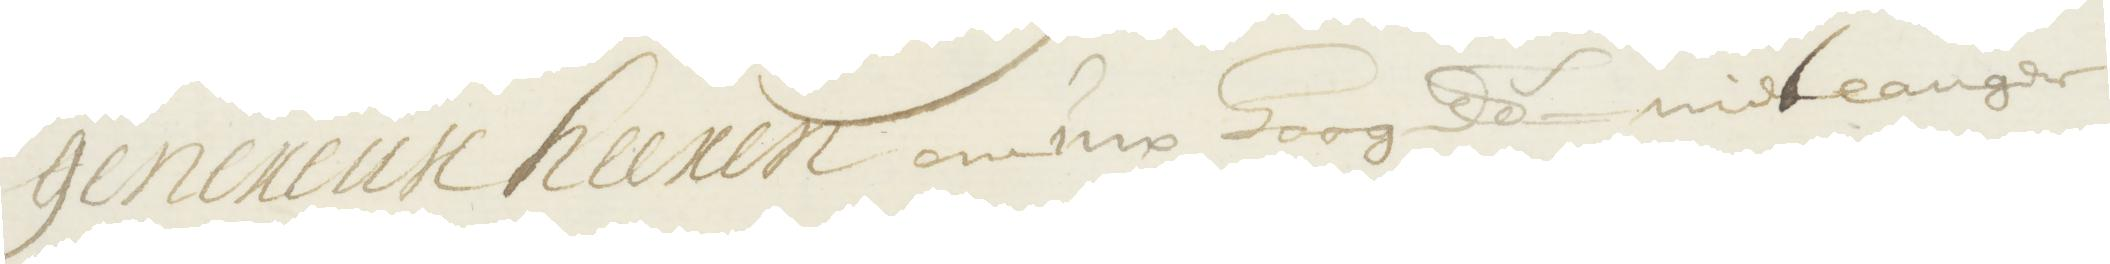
genereuse heeren om uw hoog Ed=s niet langer
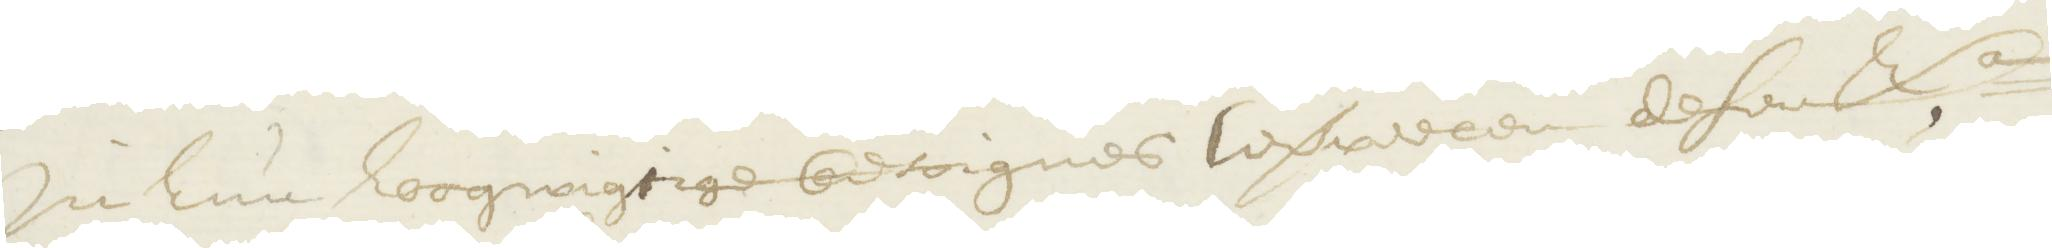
In hun hoogwigtige besoignes teverveelen desen &a
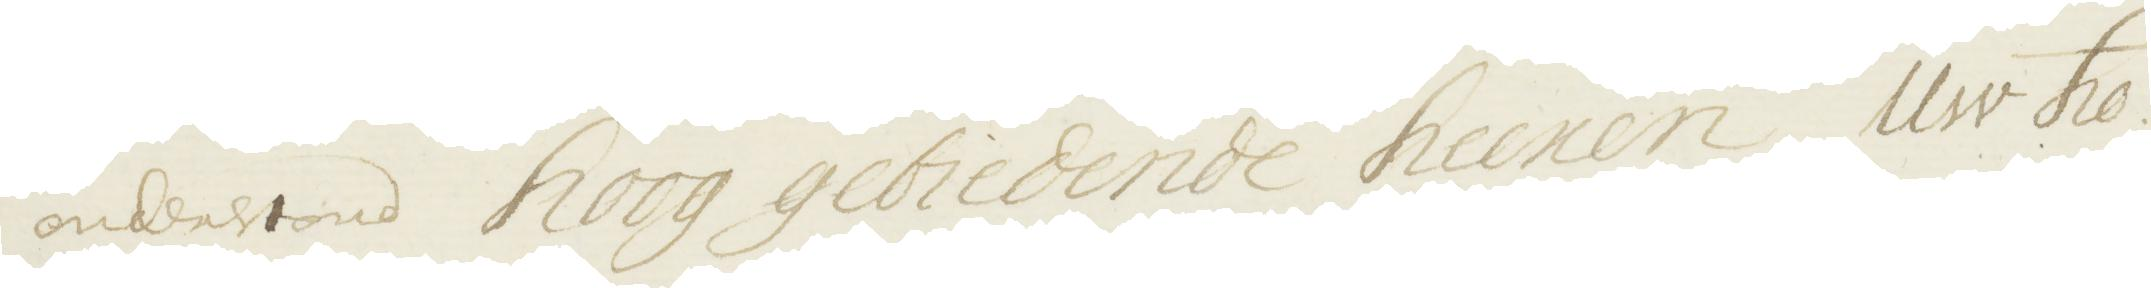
onderstond hoog gebiedende heeren Uw ho.
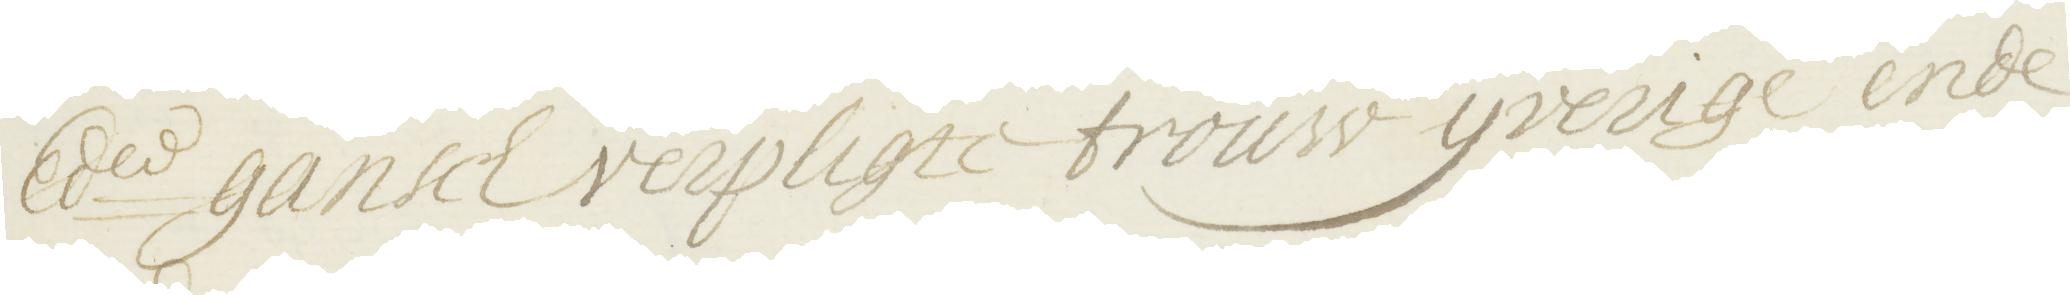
Ed=le gansch verpligte trouw ijverige ende
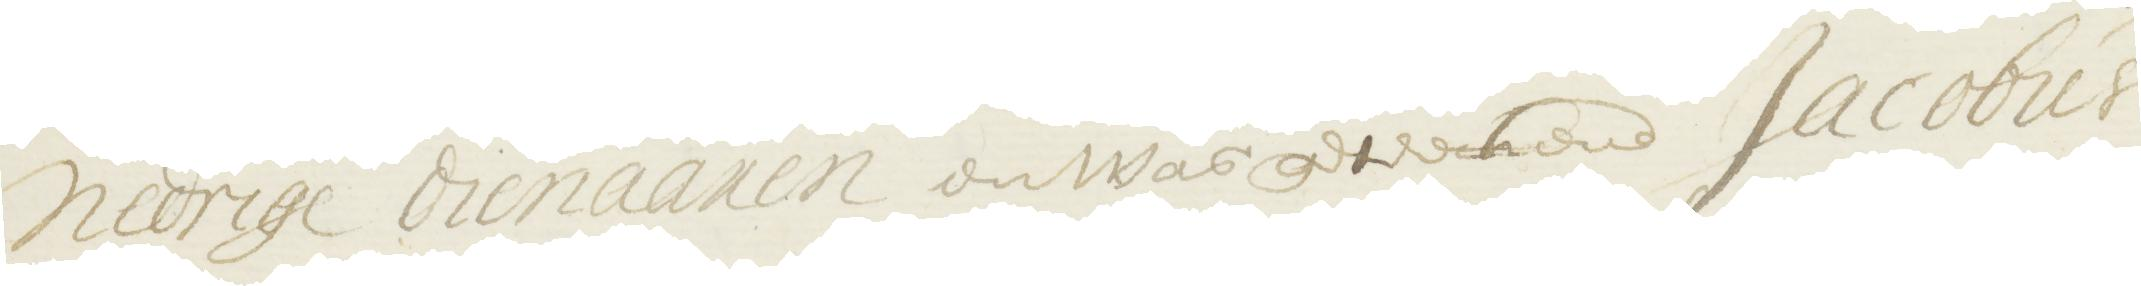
nedrige dienaaren en was geteeckend Jacobus
